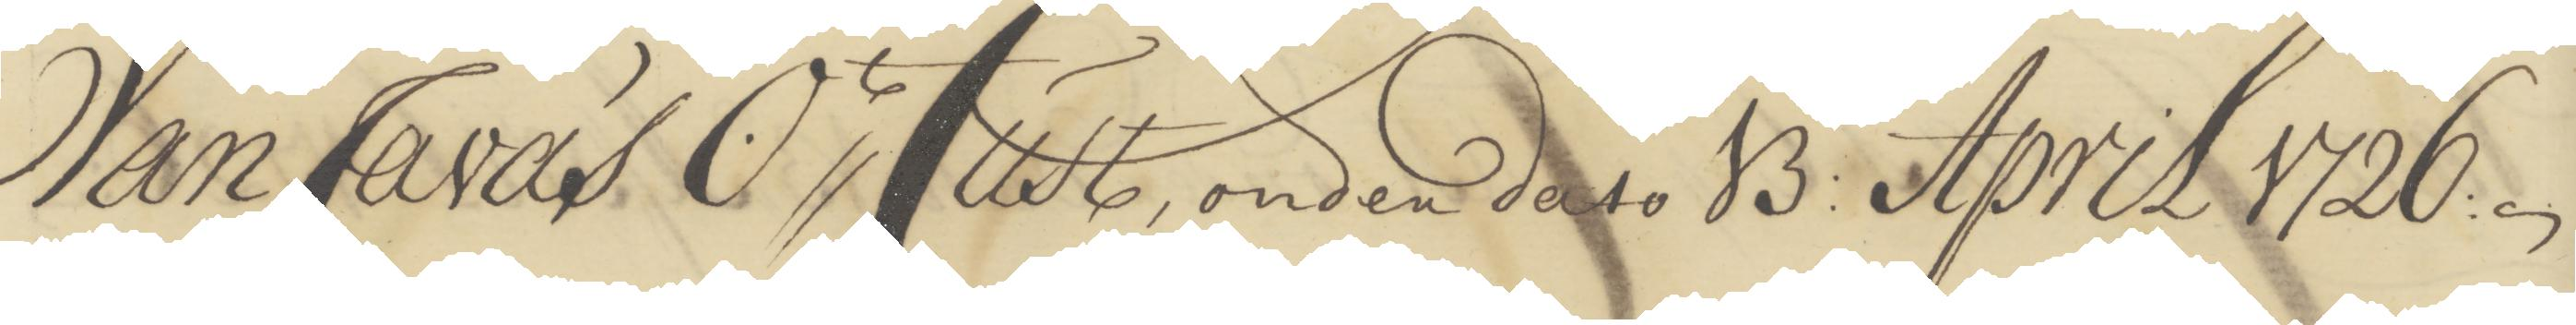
Van Java's O„t Cust, onder dato 13:e April 1726: —
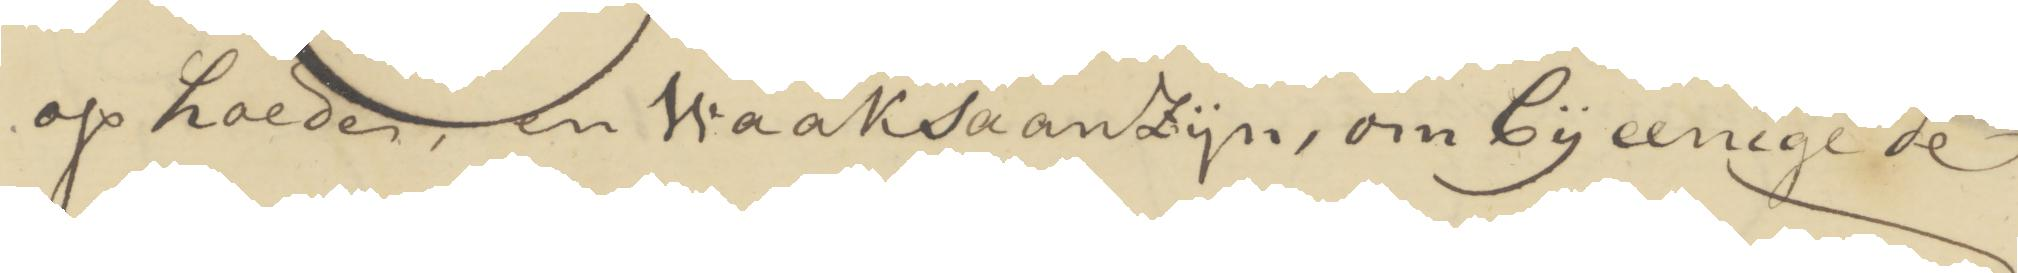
op hoeden, en waaks aanzijn, om bij eenige de
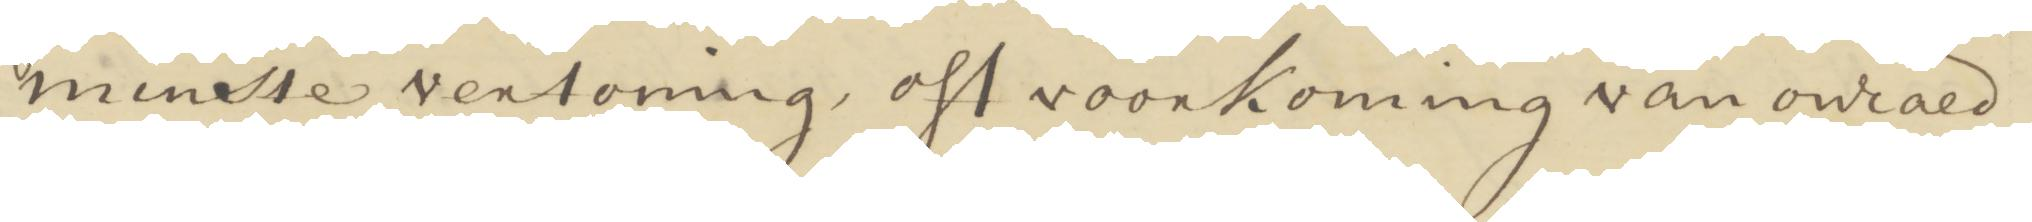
minste vertoning, oft voorkoming van onraed
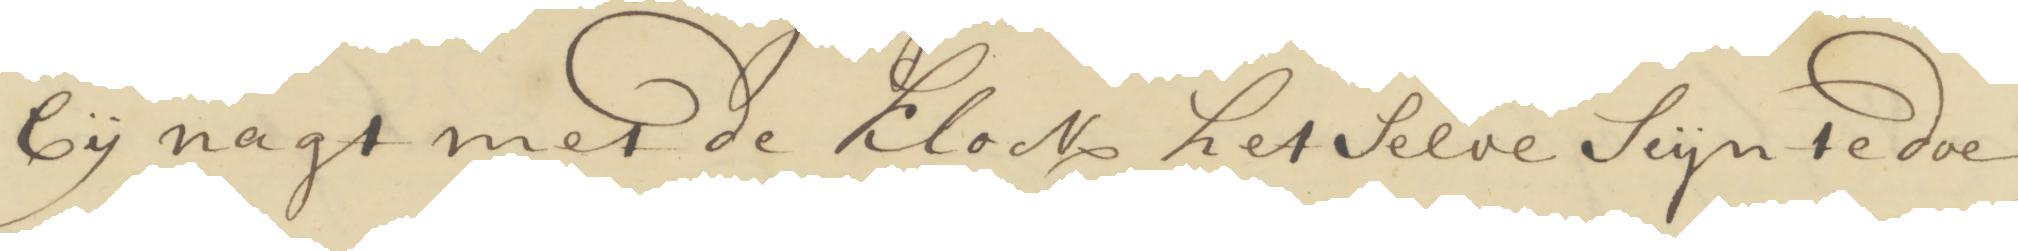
bij nagt met de klock het selve seijn te doen
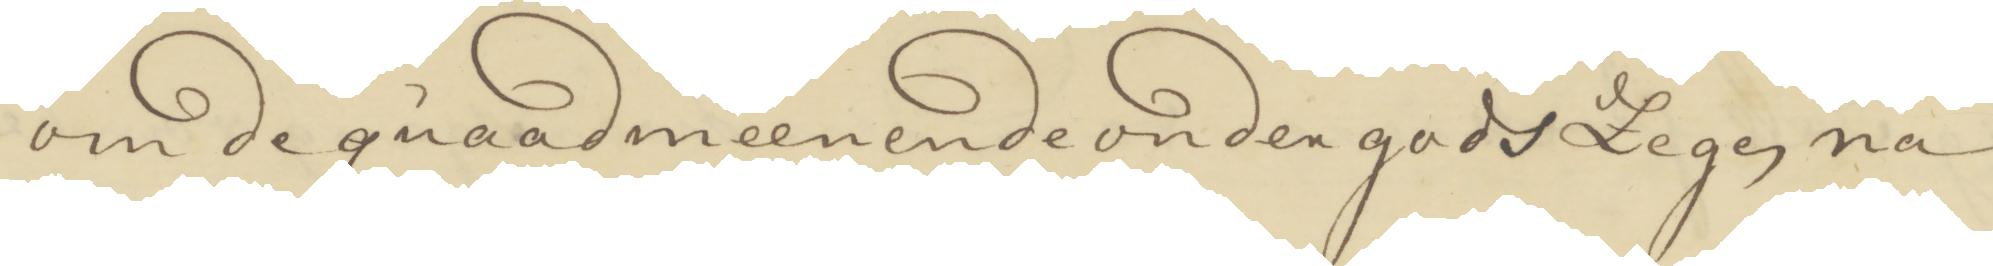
om de quaadmeenende onder gods zegen na
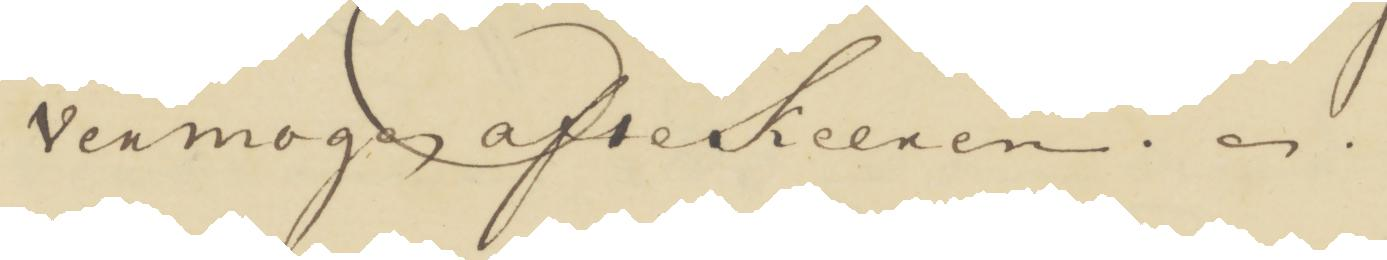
vermogen aftekeeren. — .
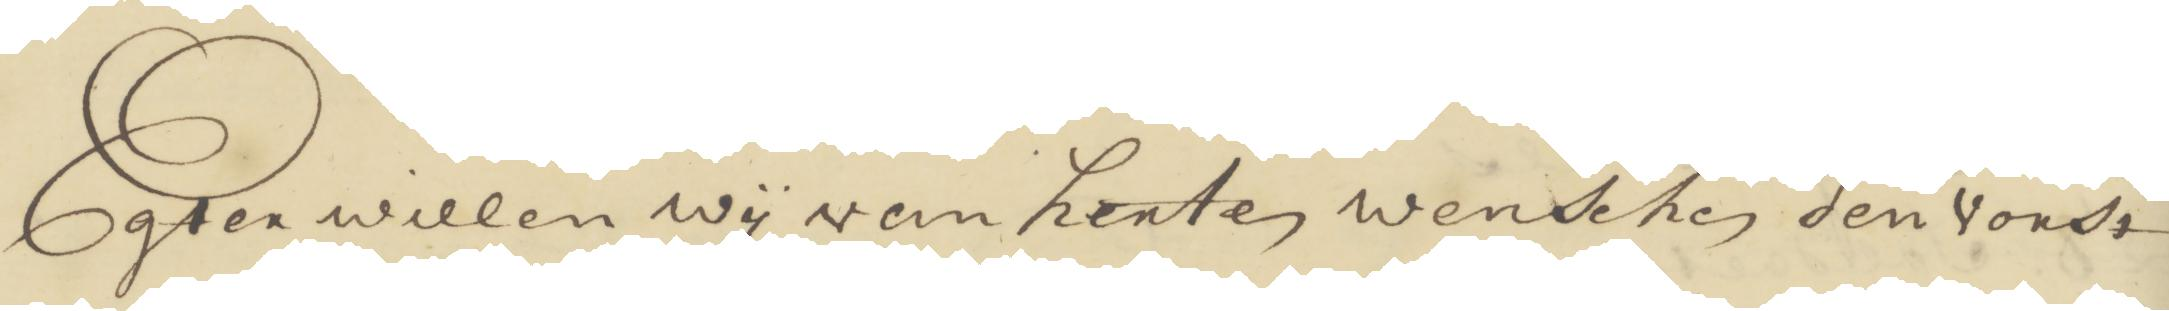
Egter willen wij van herten wenschen den vorst
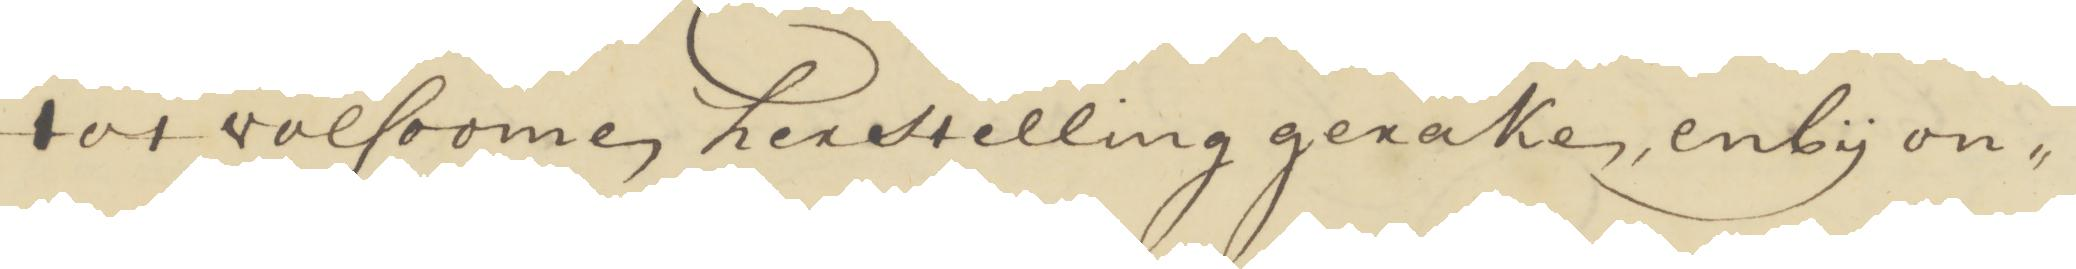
tot volcoomen herstelling geraken, en bij on„
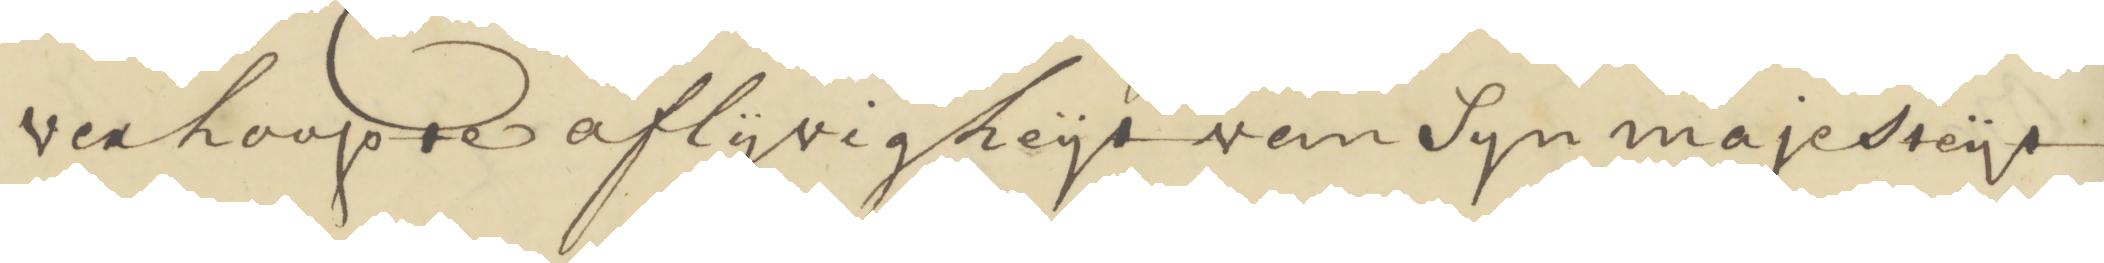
verhoopte aflijvigheijt van syn majesteijt
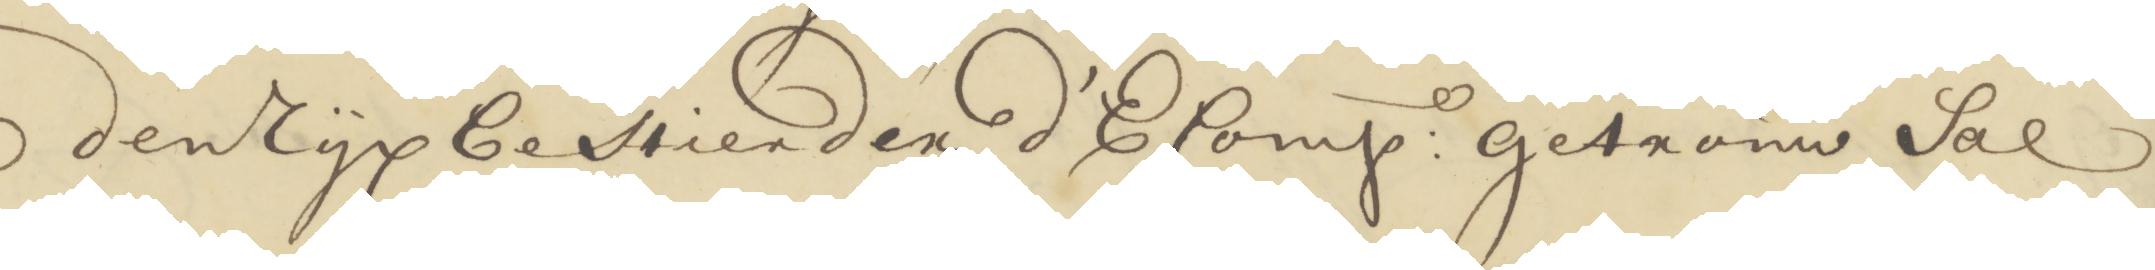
den Rijx bestierder d’ E Comp:e getrouw sal
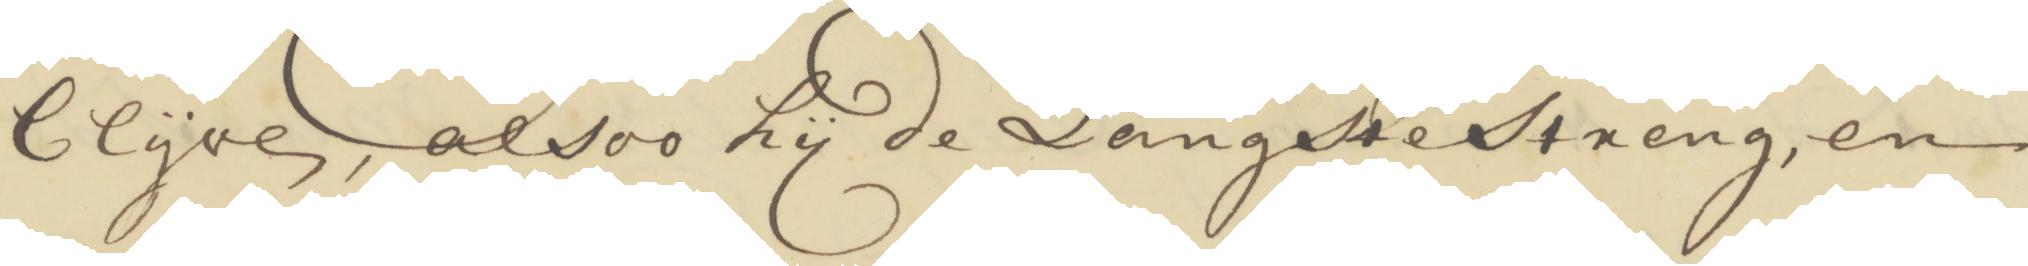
blijven, alsoo hij de Langste streng, en
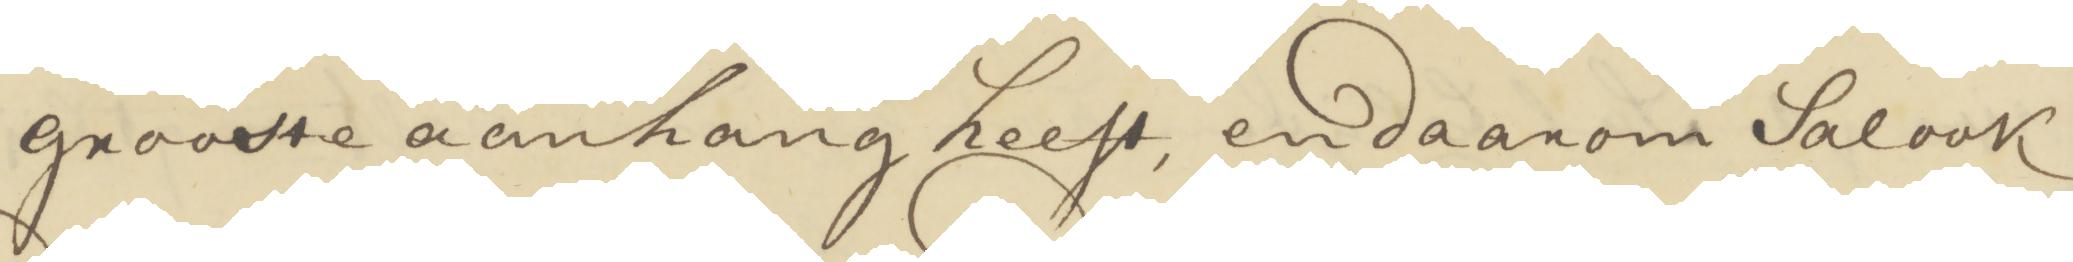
grooste aanhang heeft, en daarom sal ook
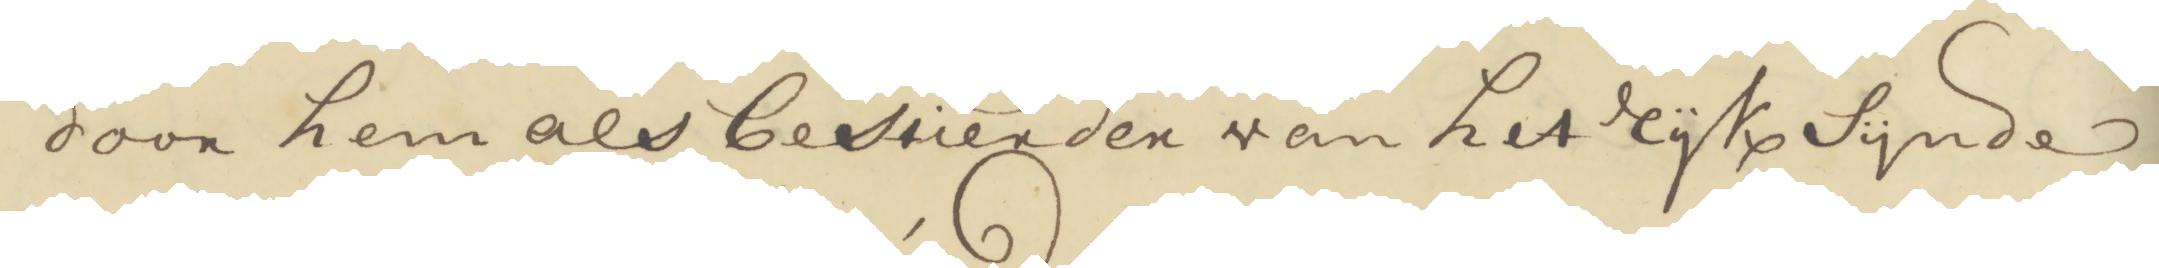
door hem als bestierder van het Rijk sijnde
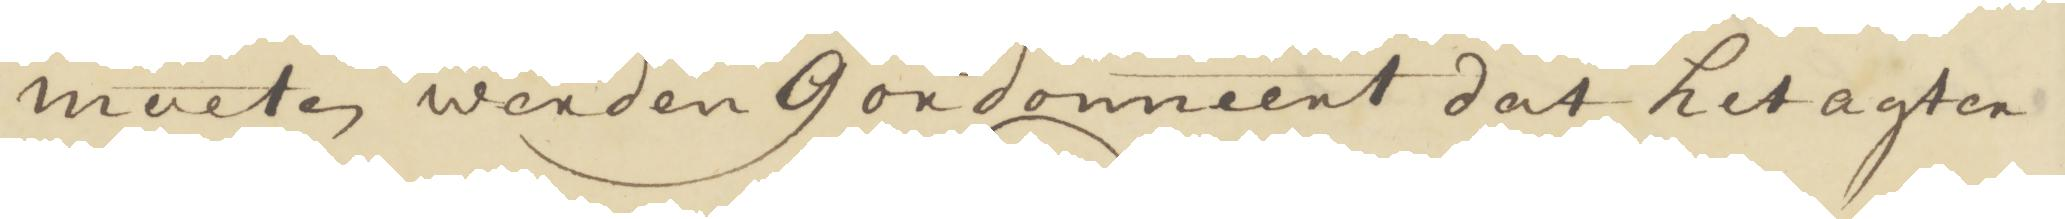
moeten werden g'ordonneert dat het agter
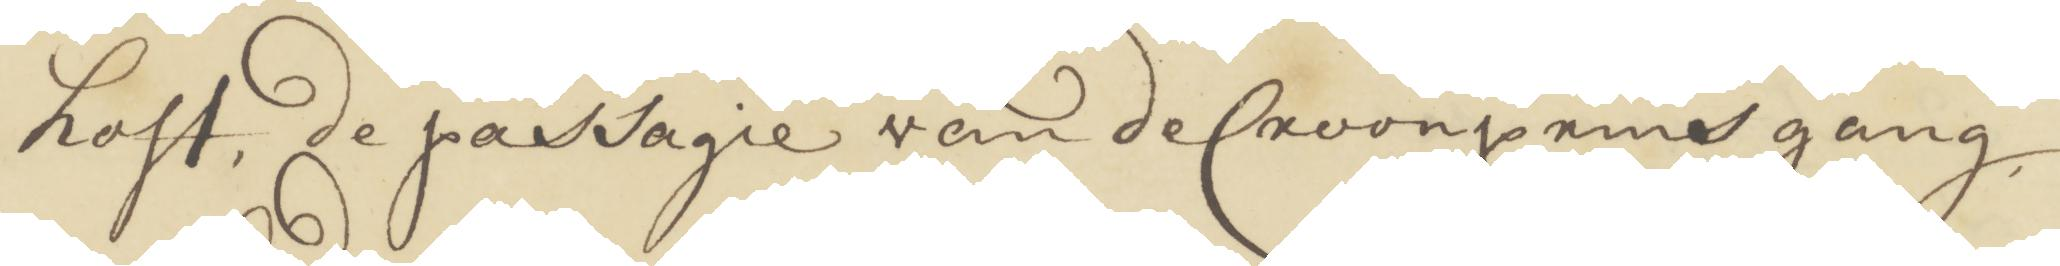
hoft, de passagie van de Croonprins gang,
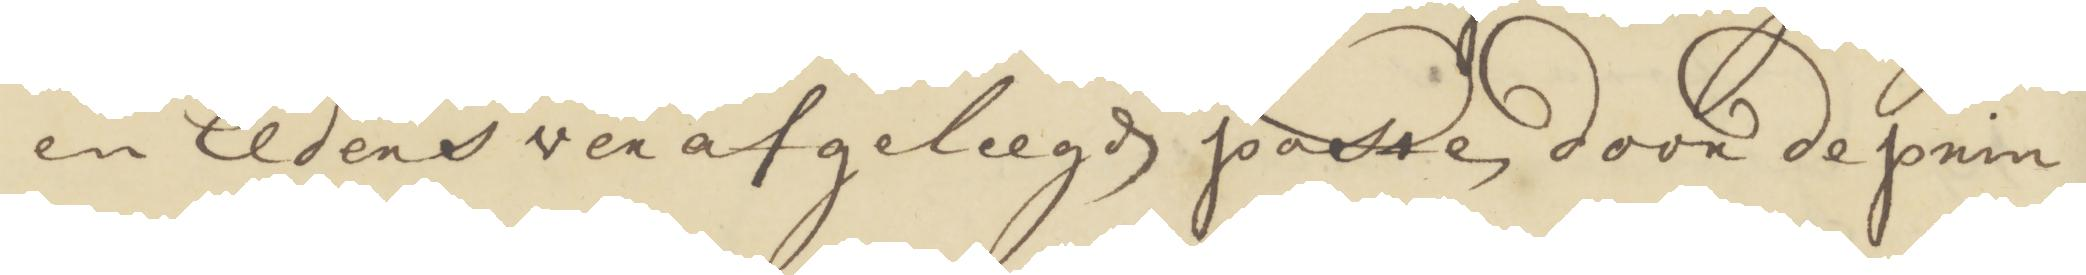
en Elders ver afgeleegen posten door de prin
